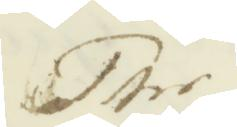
Phr
